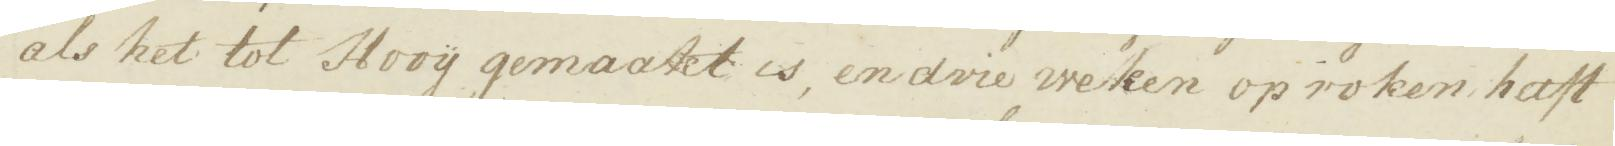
als het tot Hooij gemaakt is, en drie weken op roken, heeft
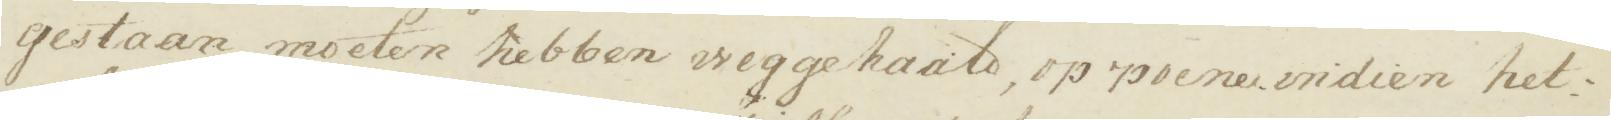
gestaan moeten hebben weggehaald, op poene, indien het:
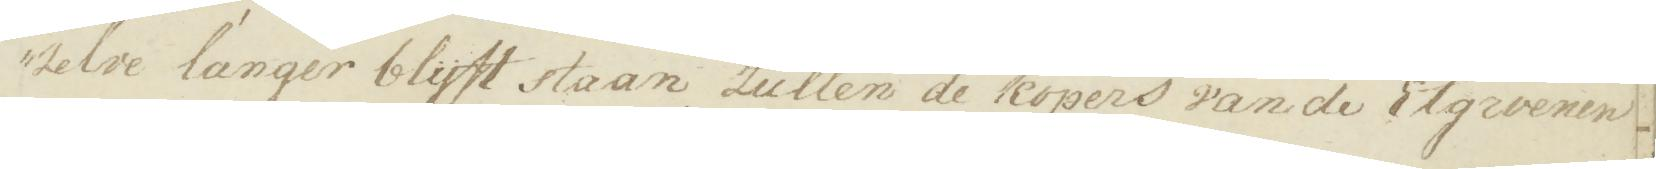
„zelve langer blijft staan, zullen de kopers van de Etgroenen
